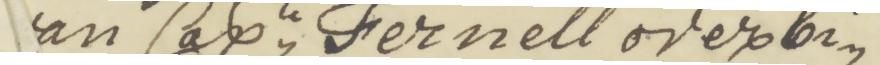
an Cap„n Fernell over bi
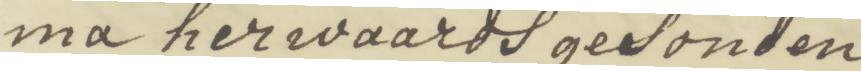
ma herwaards gesonden
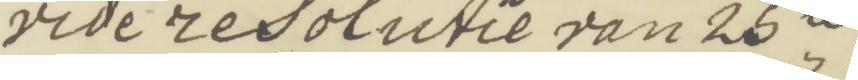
vide resolutie van 25„e
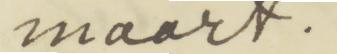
maart.
